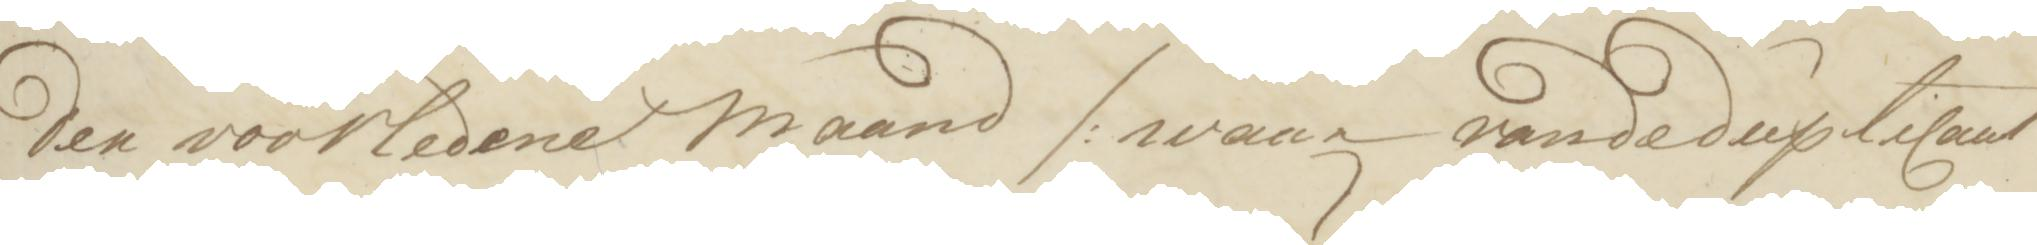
der voorledene maand /: waar van de duplicaat
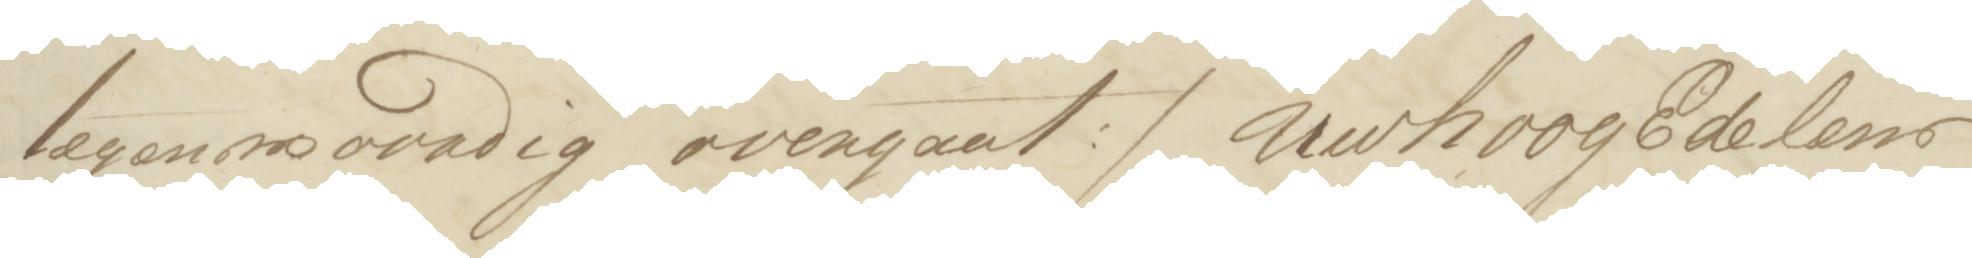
tegenwoordig overgaat :/ uw hoog Edelens
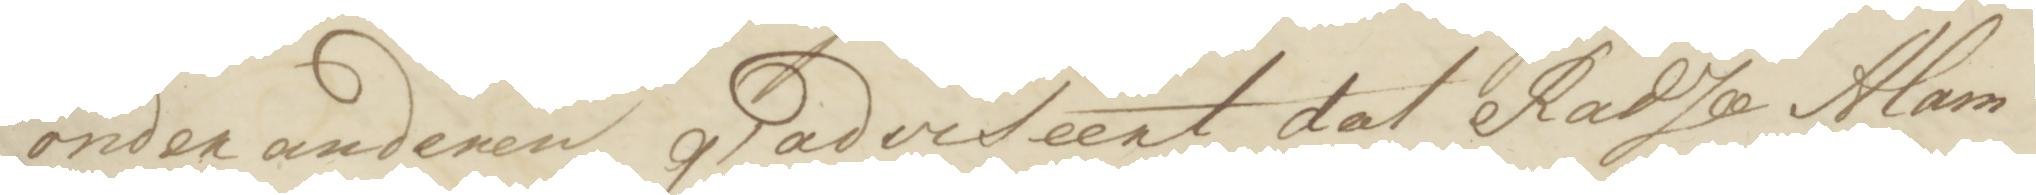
onder anderen g'adviseert dat Radja Alam
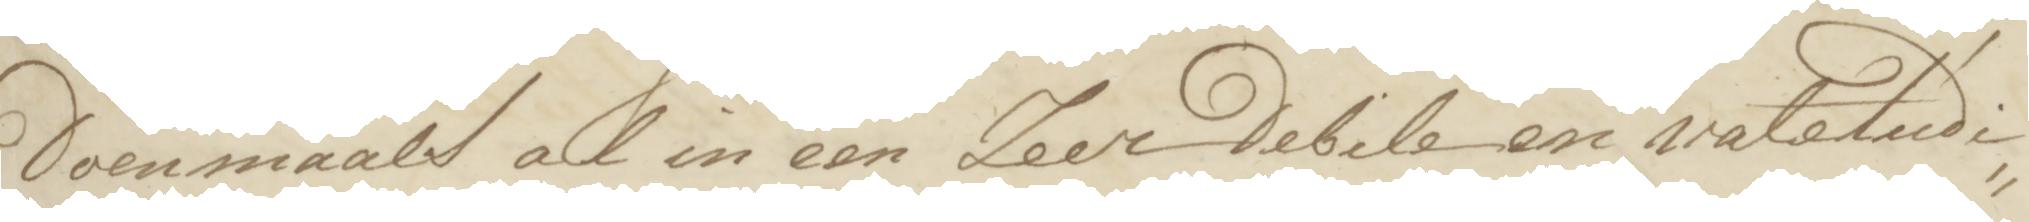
doenmaals al in een zeer debile en valetudi„
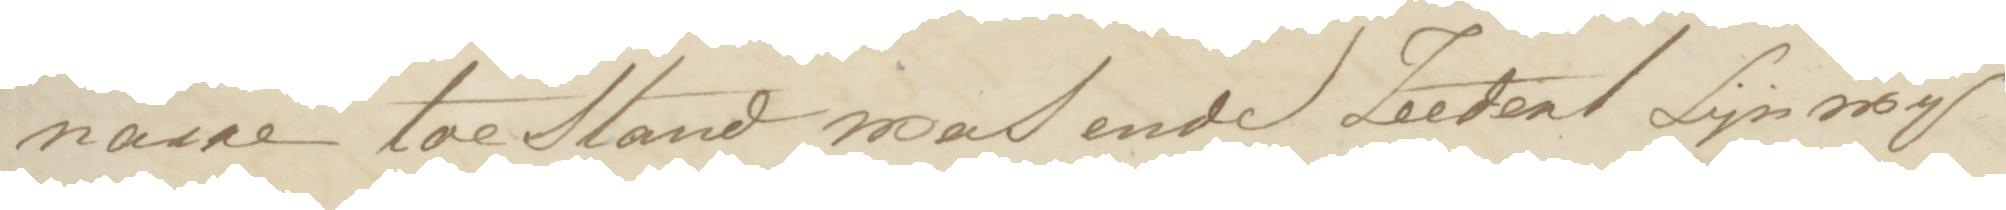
naire toestand was ende seedert sijn wij
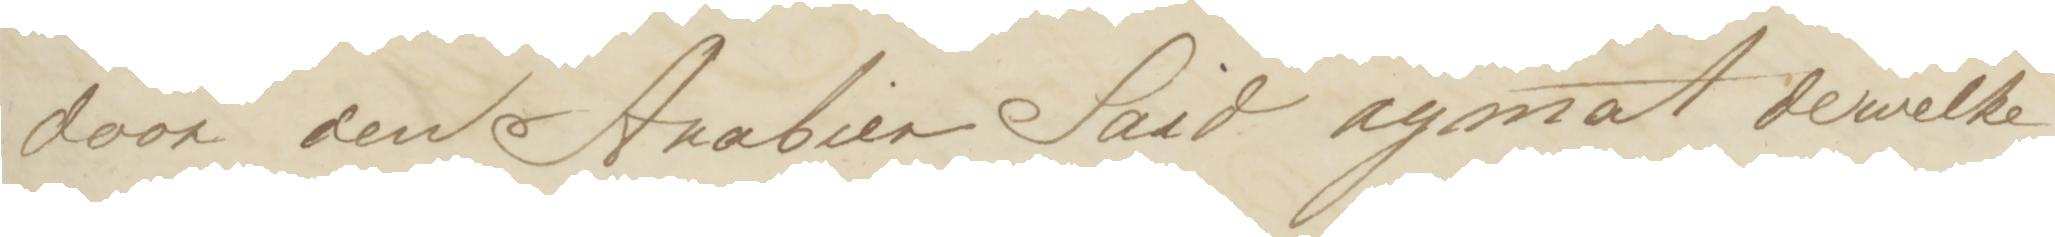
door den Arabier Said agmat dewelke
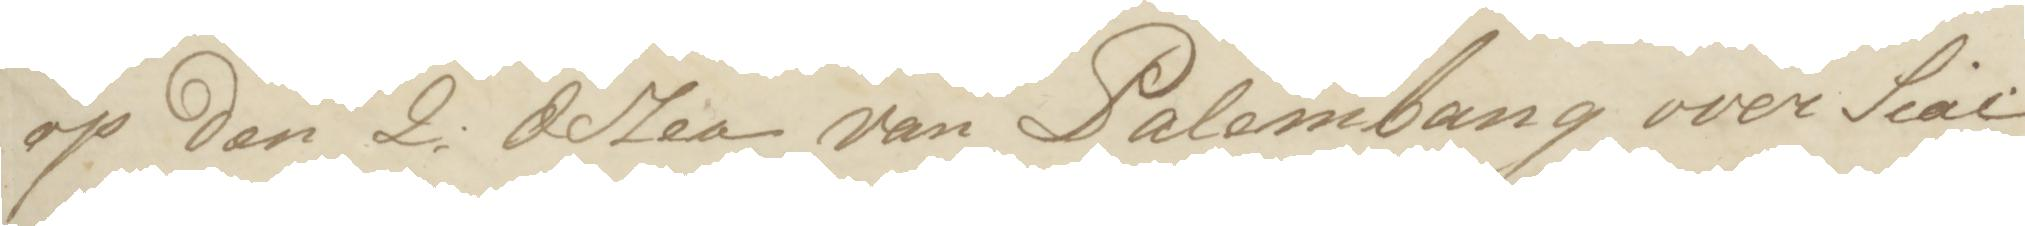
op den 2: dezer van Palembang over siac
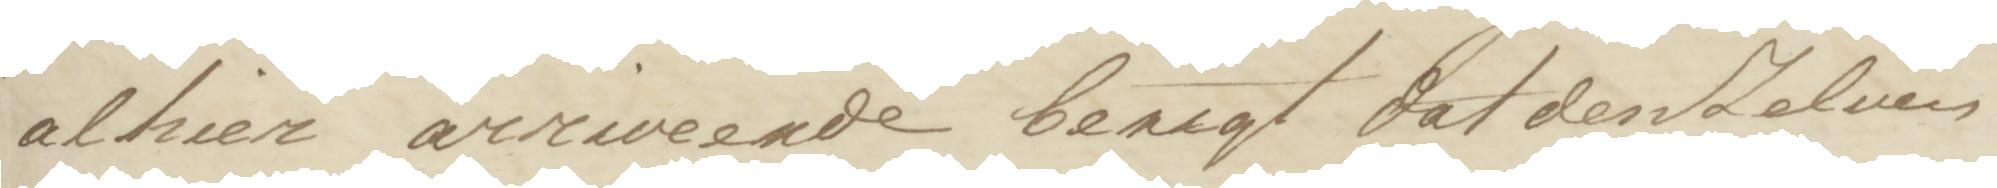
alhier arriveerde berigt dat den zelven
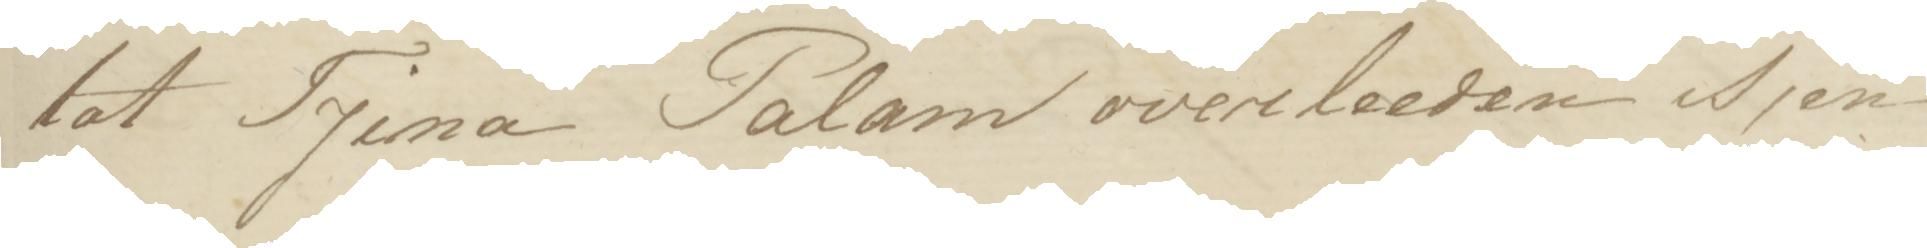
tot Tjina Palam overleeden is, en
